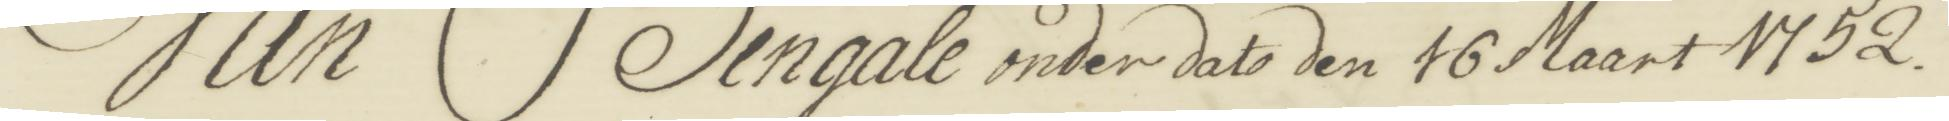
Van Bengale onder dato den 16 Maart 1752.
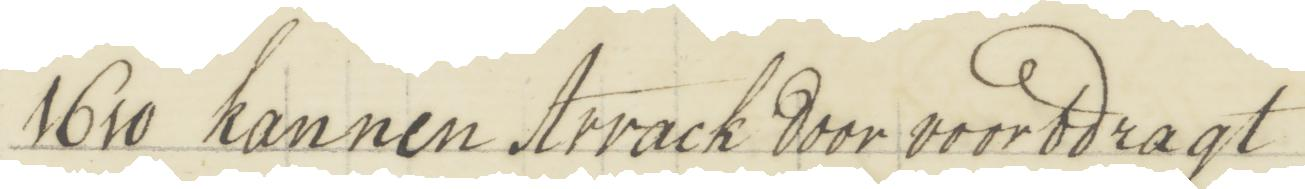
1610 kannen Arrack door voortdragt
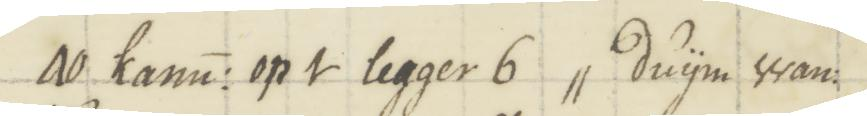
40 kann: op 1 legger 6 „ duijm wan:
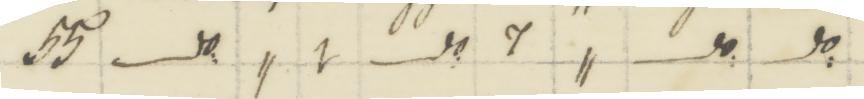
55 _„o „ 1 _„o 7 „ _„o _„o
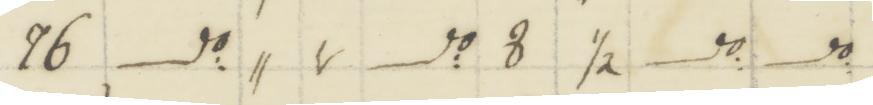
76 _„o „ 1 _„o 8 ½ _„o _„o
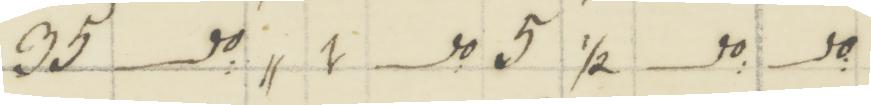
35 _„o „ 1 _„o 5 ½ _„o _„o
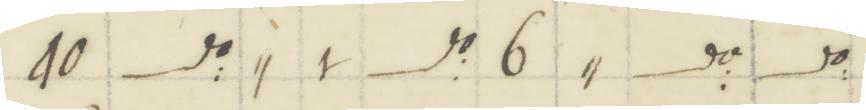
40 _„o „ 1 _„o 6 „ _„o _„o
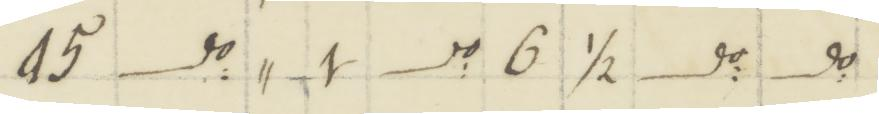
45 _„o „ 1 _„o 6 ½ _„o _„o
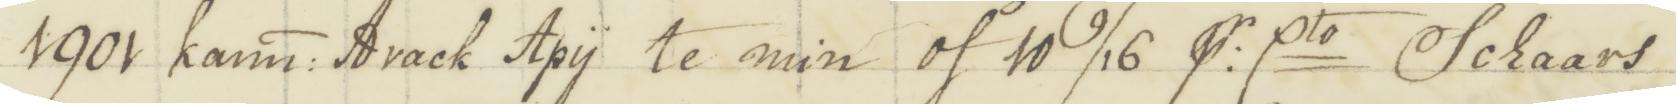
1901 kann: Arack Apij te min of 10 9/16 p:r C=to Schaars
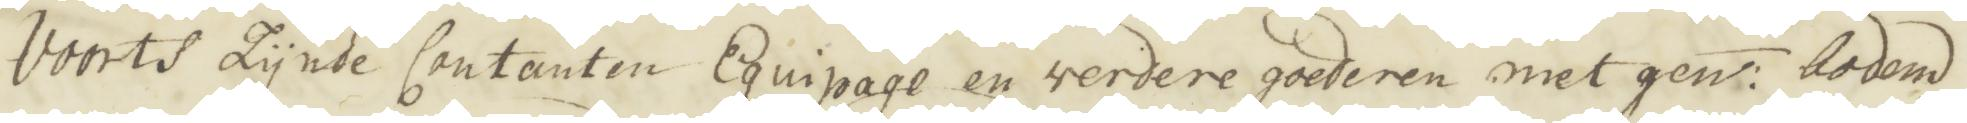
voorts Zijnde Contanten Equipage en verdere goederen met gen: bodem
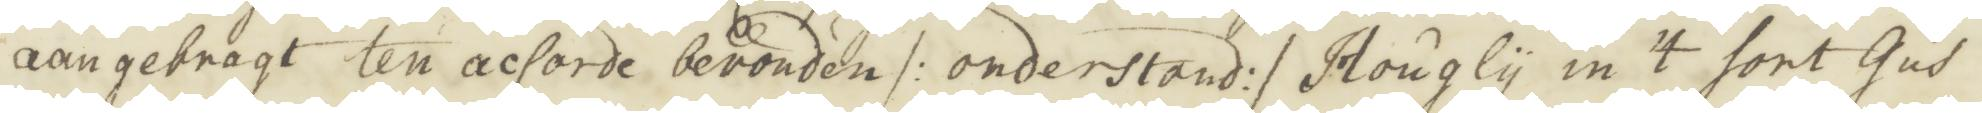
aangebragt ten accorde bevonden /:onderstond:/ Houglij in ’t fort Gus
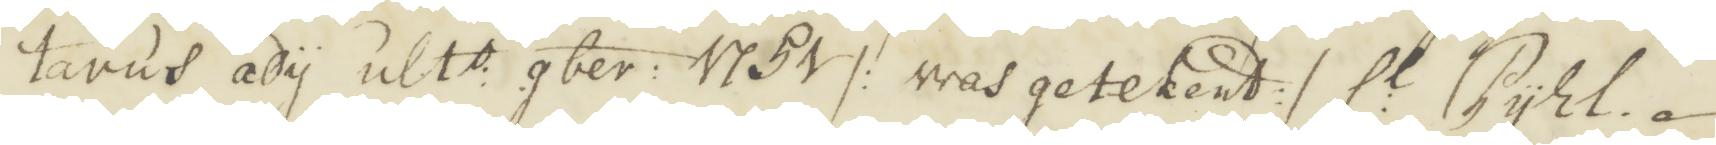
tavus adij ult:o gber: 1751 /:was getekend:/ C:l Pijhl. —
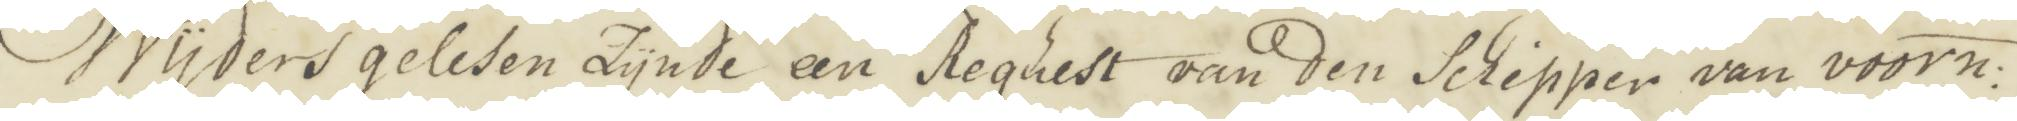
Wijders gelesen Zijnde een Request van den Schipper van voorn:
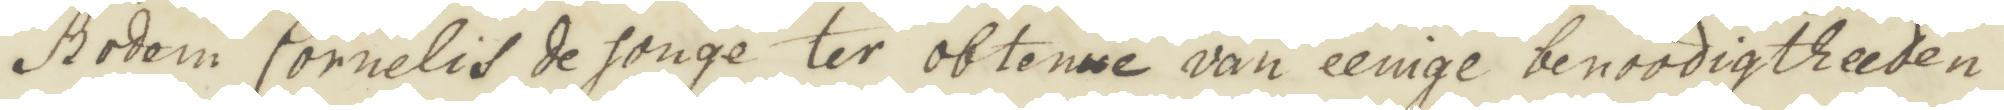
Bodem Cornelis de jonge ter obtenue van eenige benoodigtheeden
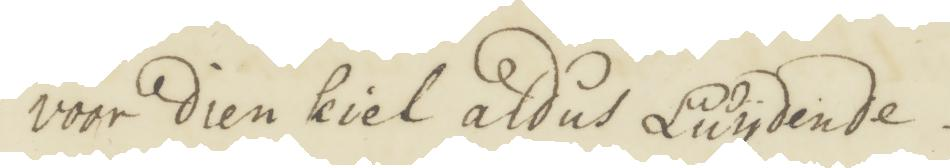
voor dien kiel aldus Luijdende
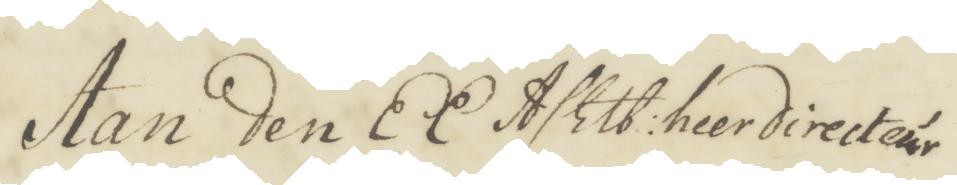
Aan den E E Achtb: heer directeur
